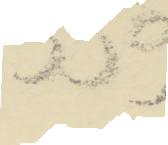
559
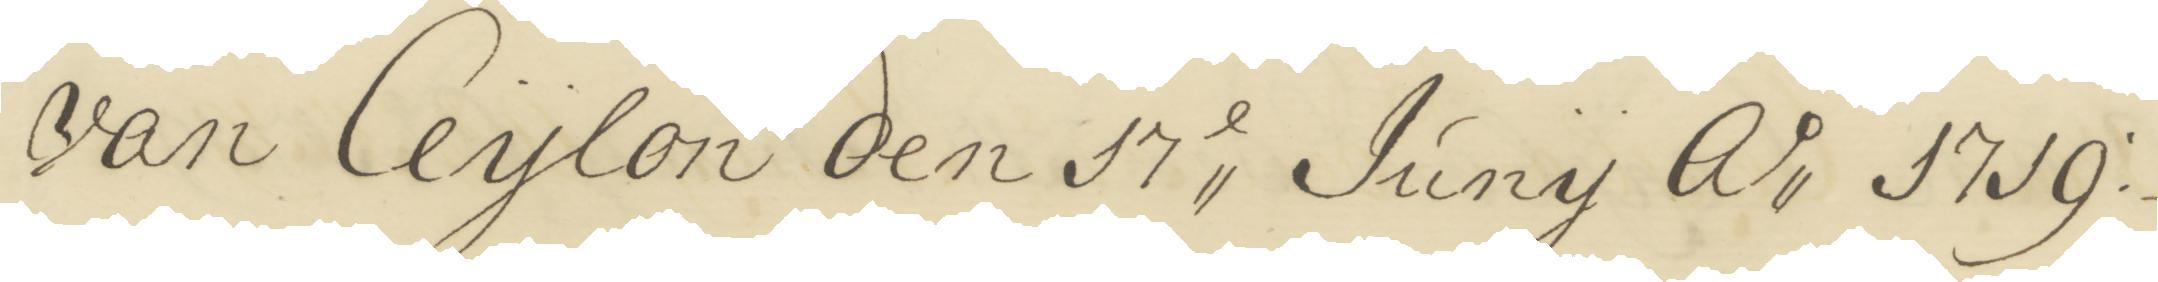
van Ceijlon den 17„e Iunij A„o 1719:
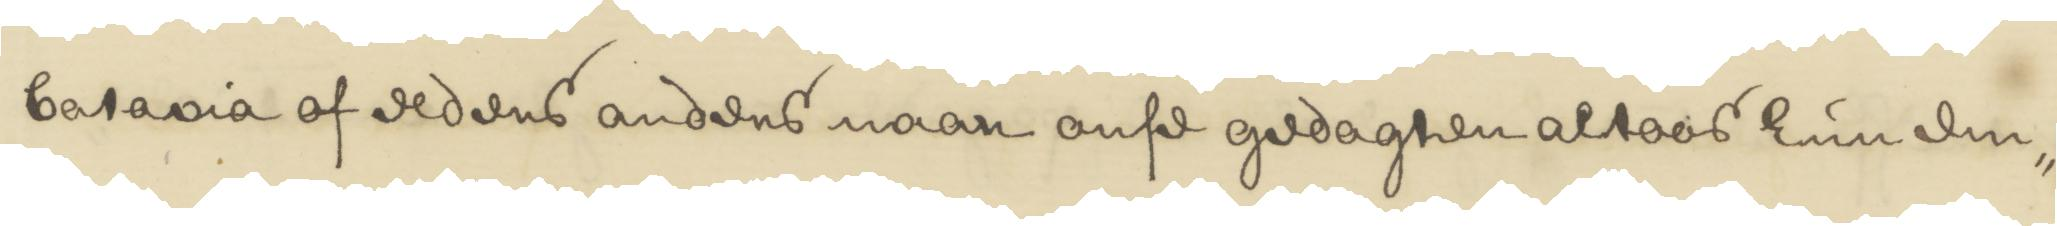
batavia of elders anders naar onse gedagten altoos hun Em„
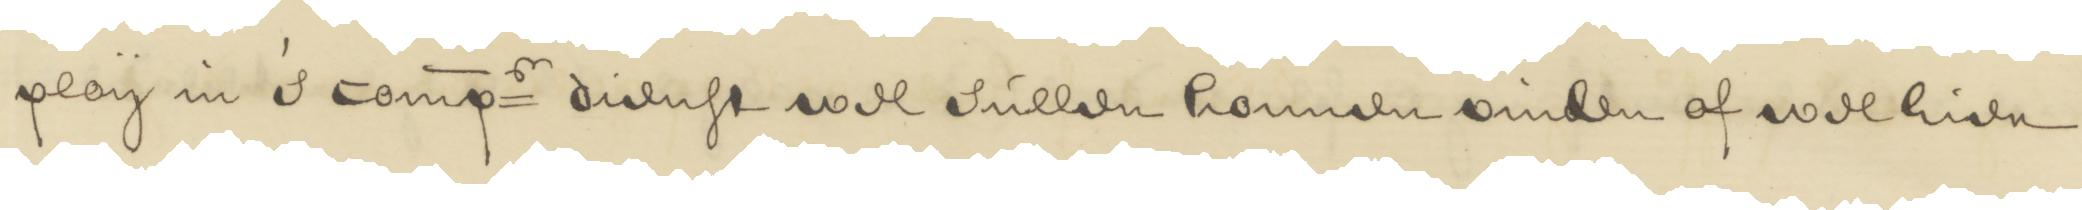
ploij in ’s comp=s dienst wel sullen konnen vinden of wel hier
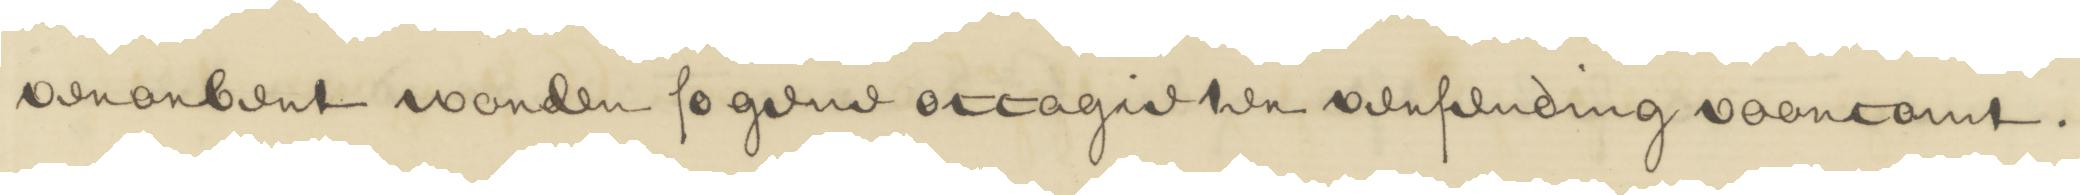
verorbert worden so gene occagie ter versending voorcomt.
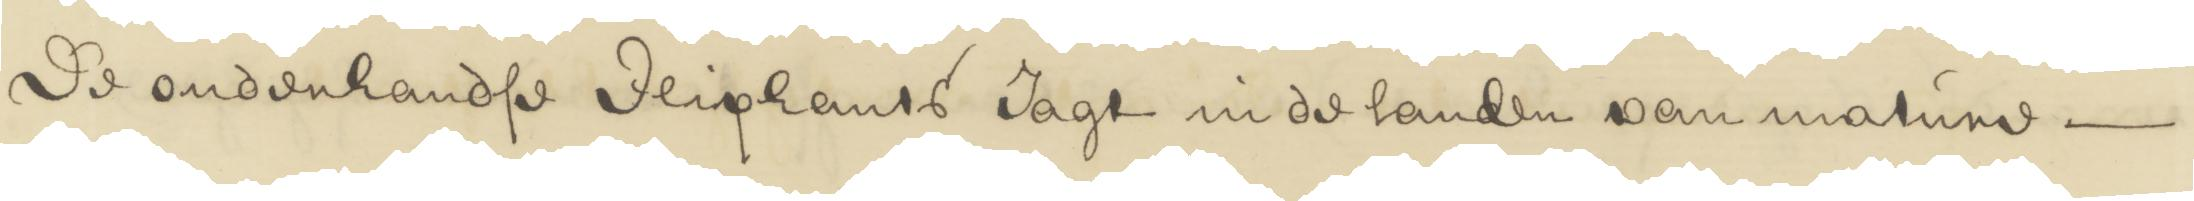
De onderhandse Eliphants Iagt in de landen van mature —
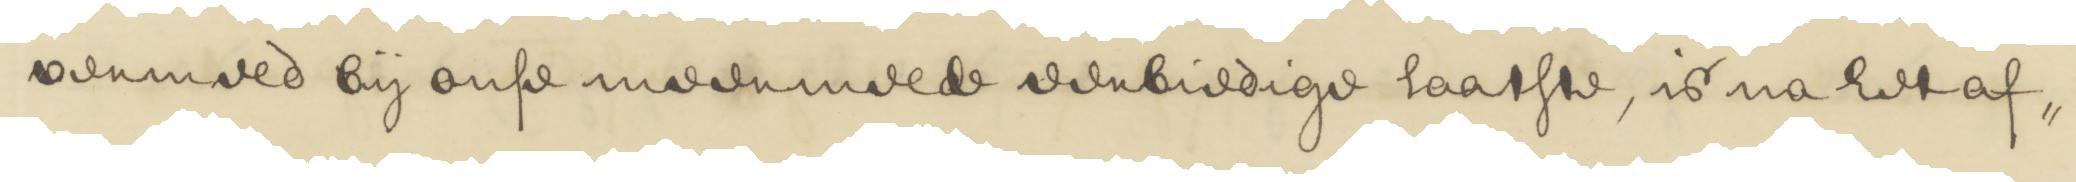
vermeld bij onse meermelde eerbiedige laatste, is na het af„
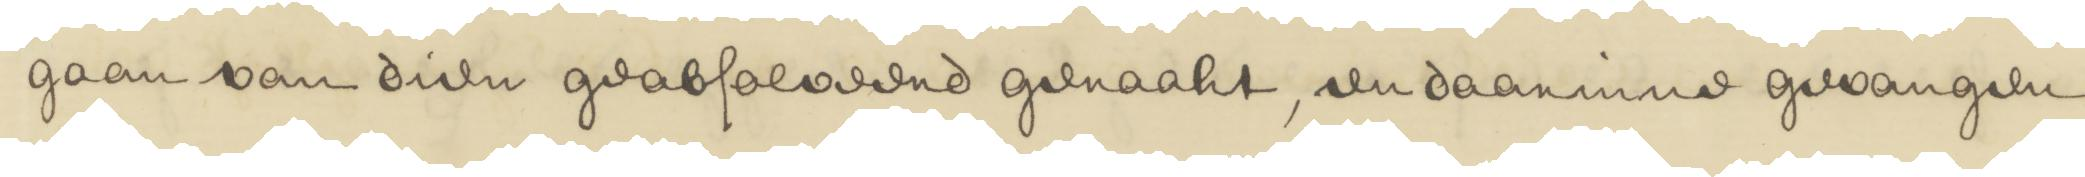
gaan van dien geabsolveerd geraakt, en daarinne gevangen
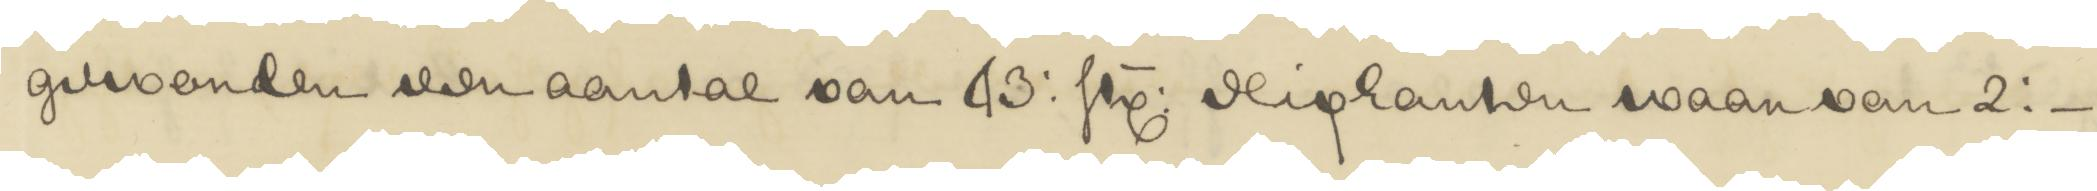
geworden een aantal van 43: stx: eliphanten waar van 2:
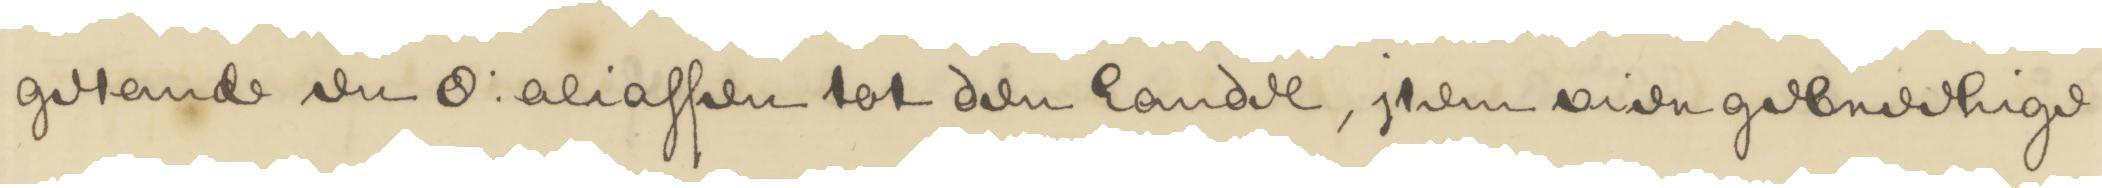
getande en 8: aliassen tot den handel, jtem vier gebreekige
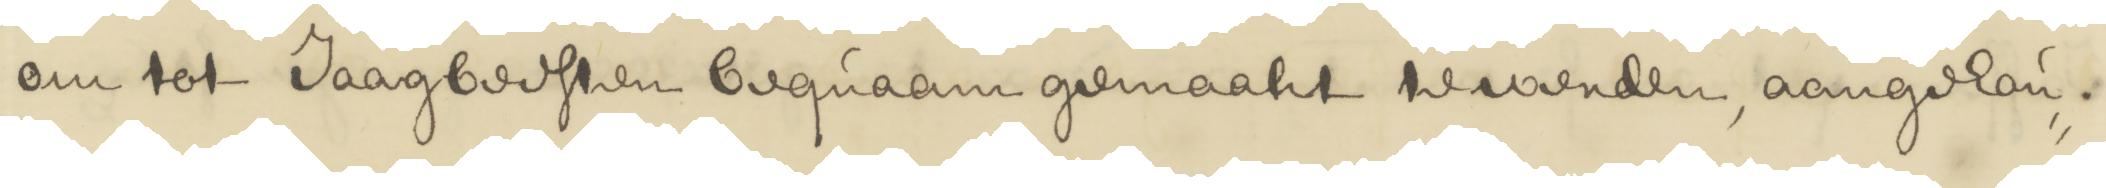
om tot Iaagbeesten bequaam gemaakt te werden, aangehou„
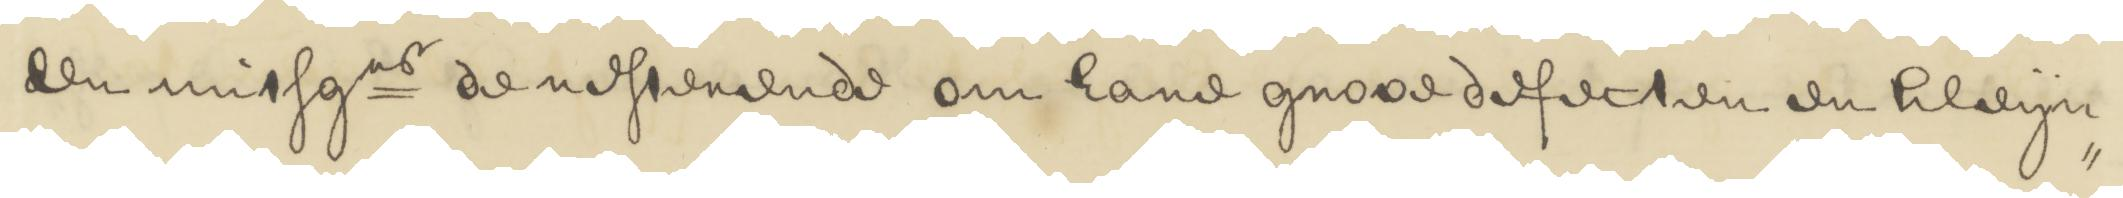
den mitsg=rs de resterende om hare grove defecten en kleijn„
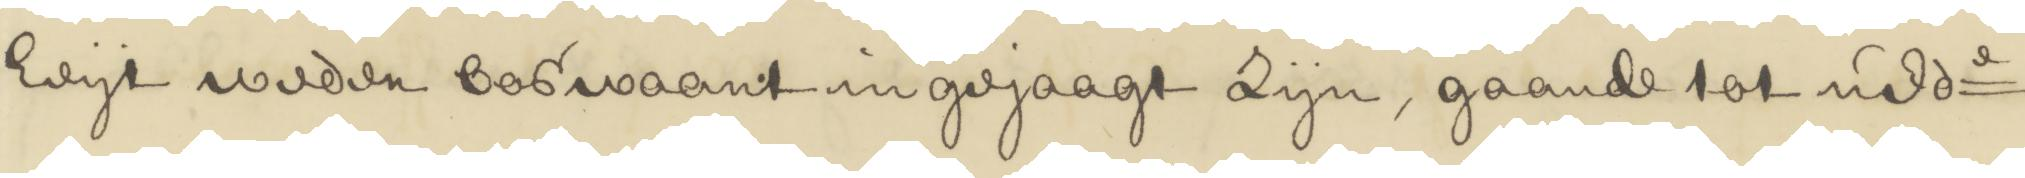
heijt weder boswaart in gejaagt zijn, gaande tot uEd=e
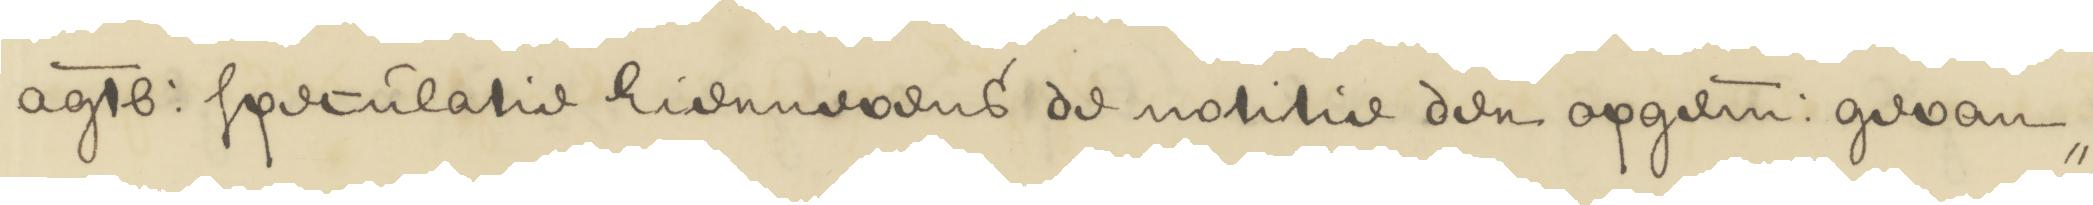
agtb: speculatie hier nevens de notitie der opgem: gevan„
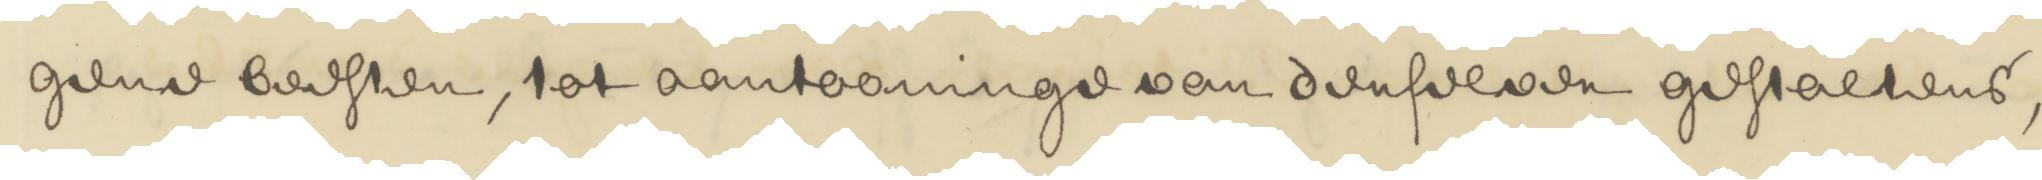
gene beesten, tot aantooninge van derselver gestaltens,
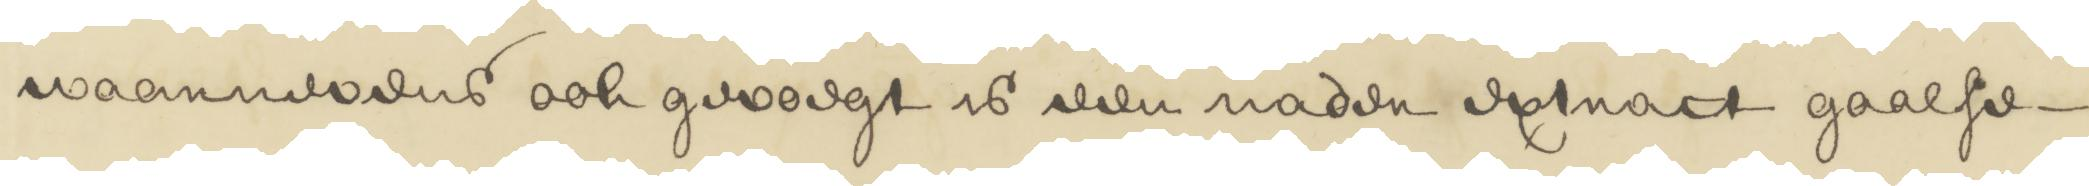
waarnevens ook gevoegt is een nader extract gaalse-
